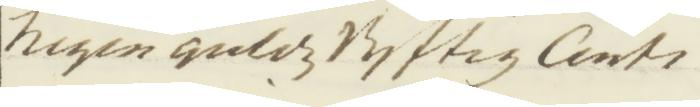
negen gulden Vyftig Cents
